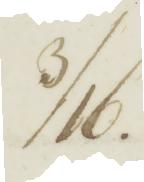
3/16.
